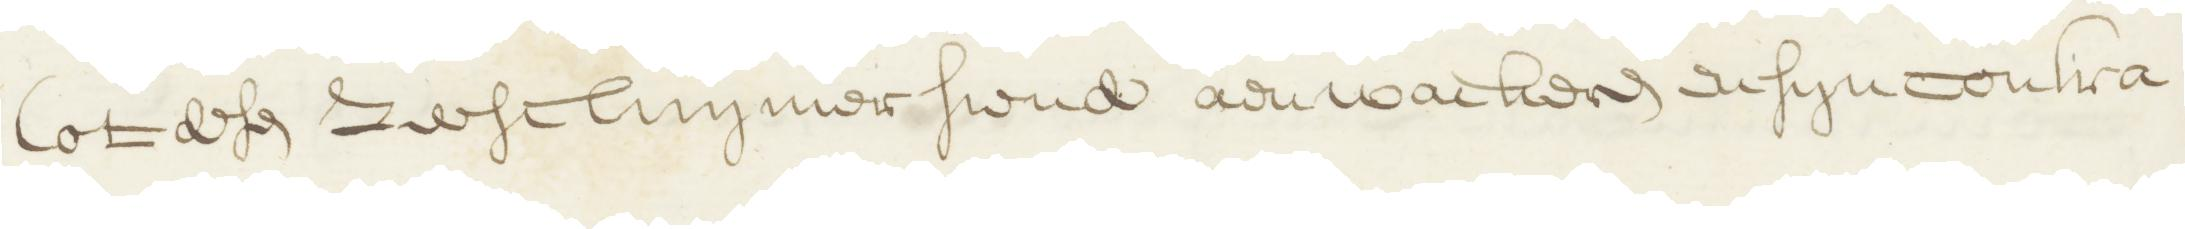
tot desen zeeschuymer siende aenwackeren en syn contra
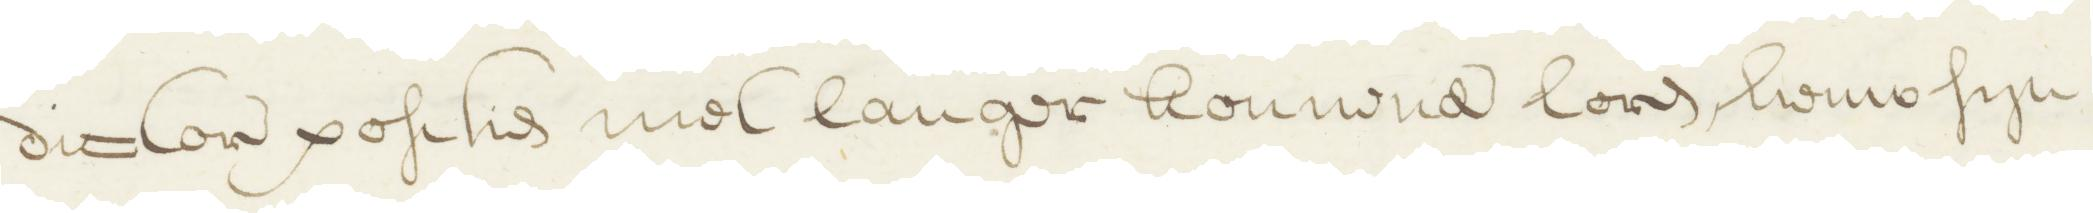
dictor positien niet langer konnende horen, lieuw sijn
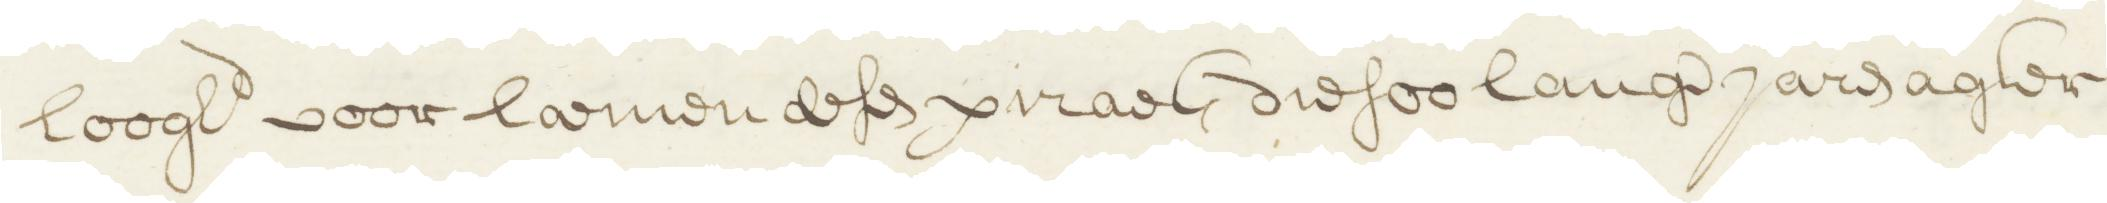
hooghd voor loemen desen piraet, die soo lange jaren agter
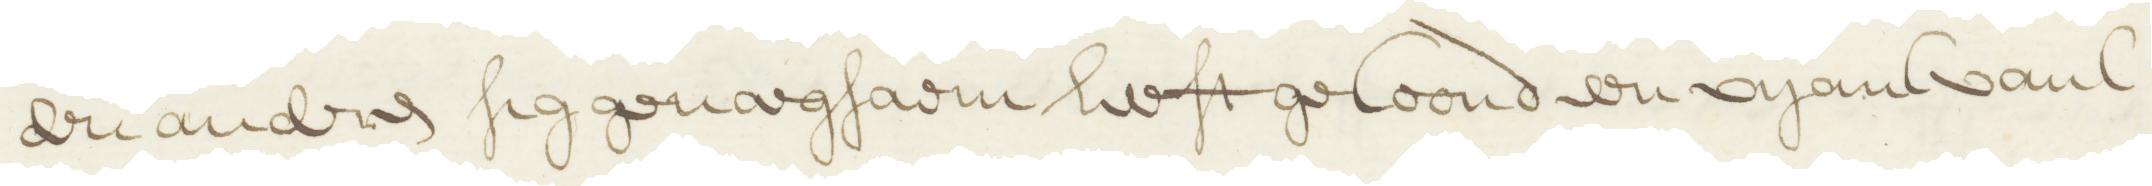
den anderen sig genoegsaem heeft getoond een vyant vant
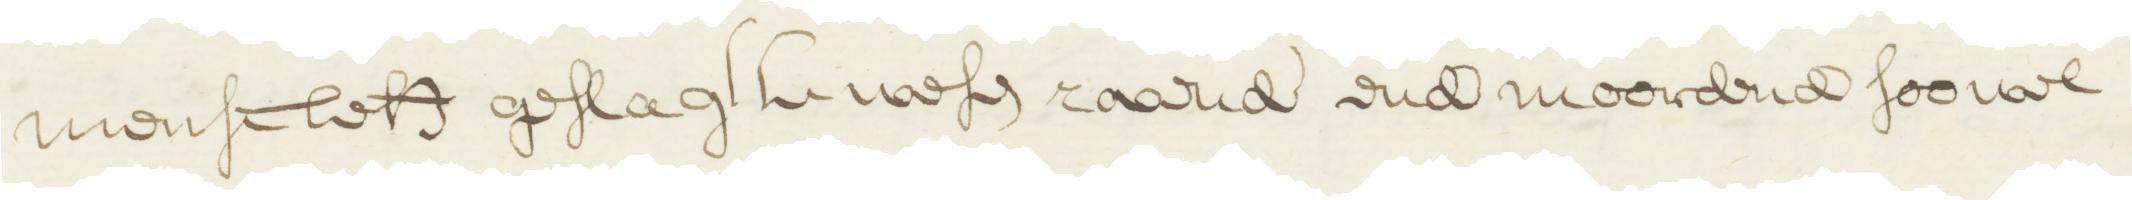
menschelijk geslagt te wesen rovende ende moordende soo wel
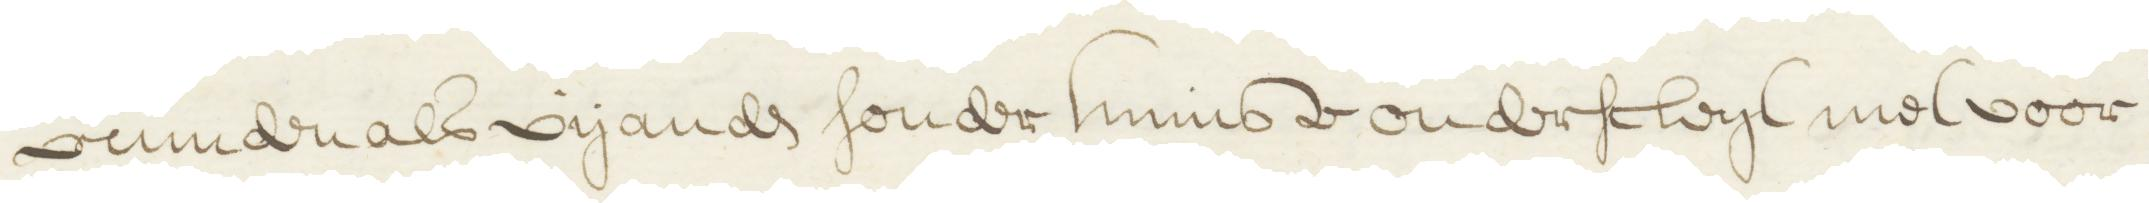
vrunden als vijanden sonder tminste onderscheyt niet voor
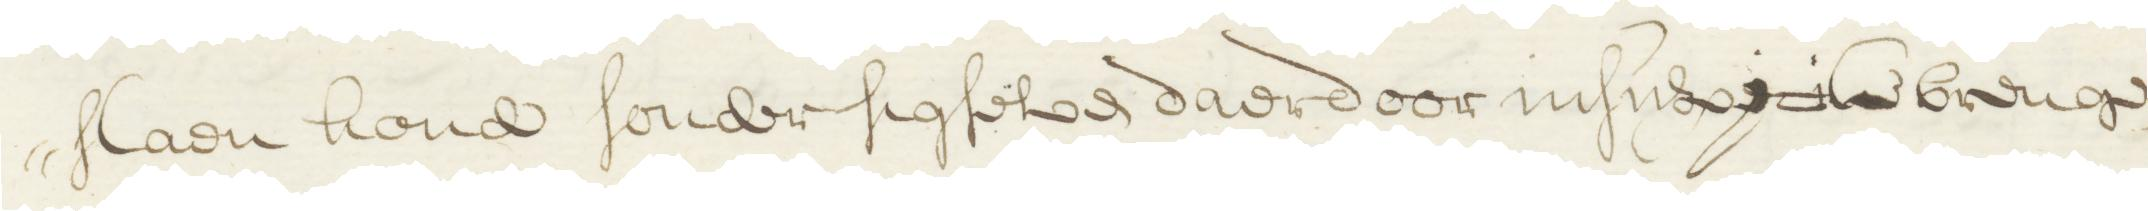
„staen konde sonder sigselven daerdoor insuspici te brenge.
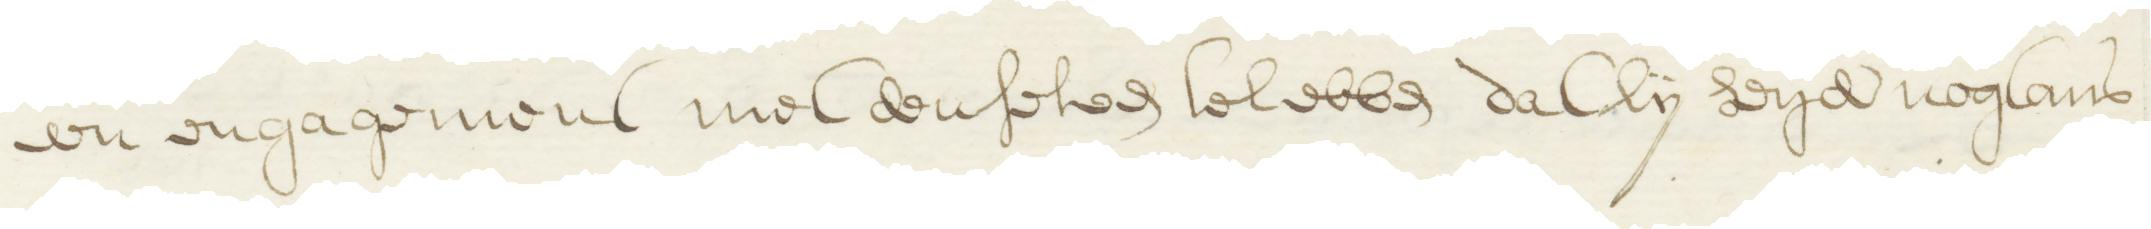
een engagement met den selven te hebben dat hij seijde nogtans
